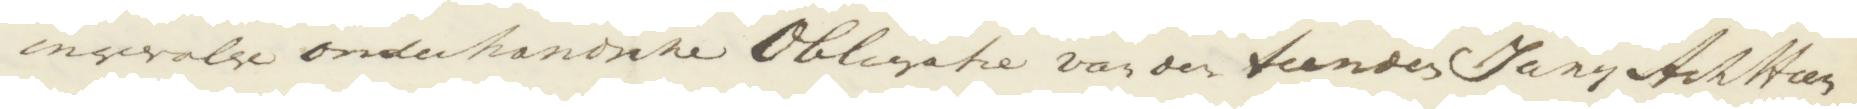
ingevolge onderhandsche Obligatie van den tienden Iuny Achttien
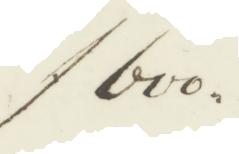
ƒ 600„
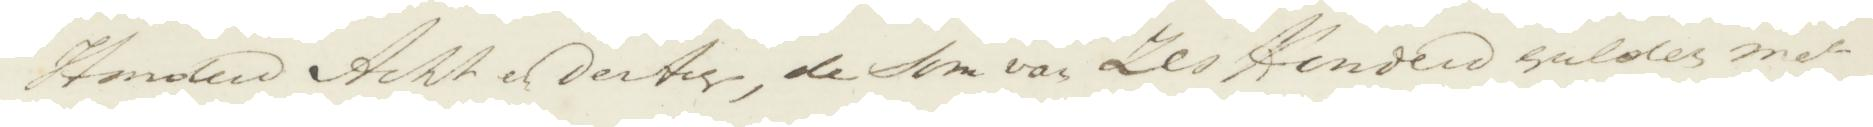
Honderd Acht en dertig, de som van Zes Honderd gulden met
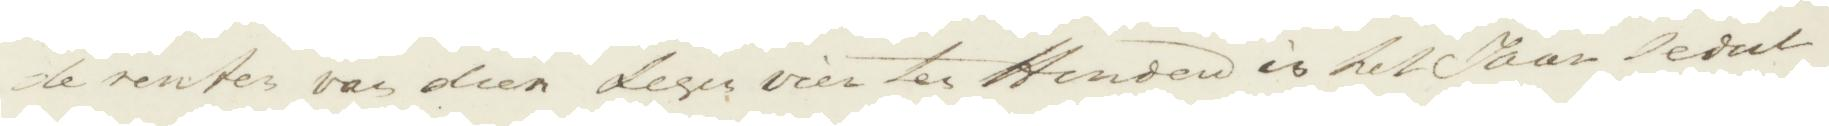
de renten van dien tegen vier ten Honderd in het Iaar sedert
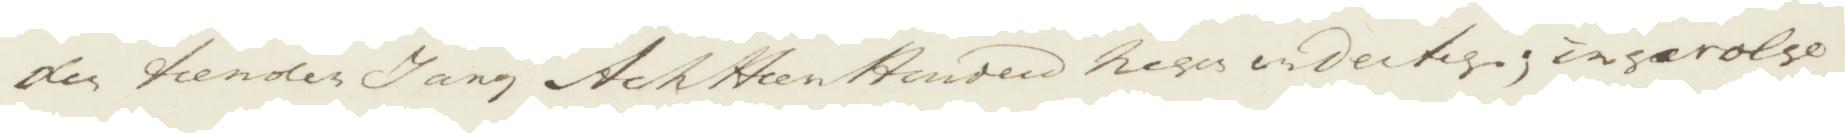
den tienden Iuny Achttien Honderd negen en dertig; ingevolge
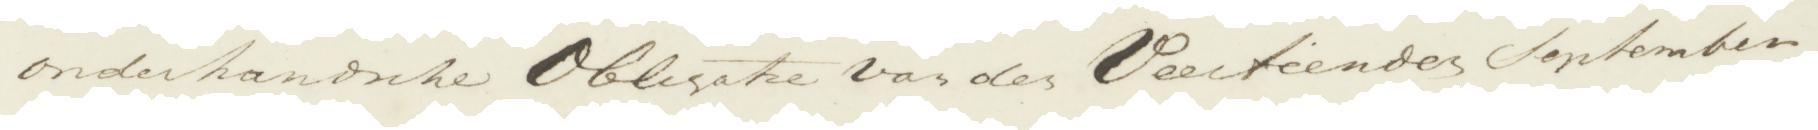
onderhandsche Obligatie van den Veertienden september
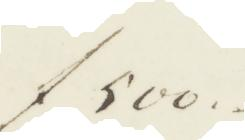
ƒ 500.
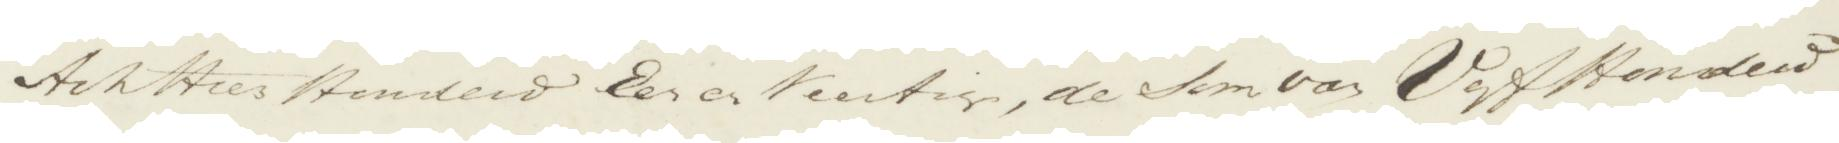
Achttien Honderd Een en Veertig, de som van Vyf Honderd
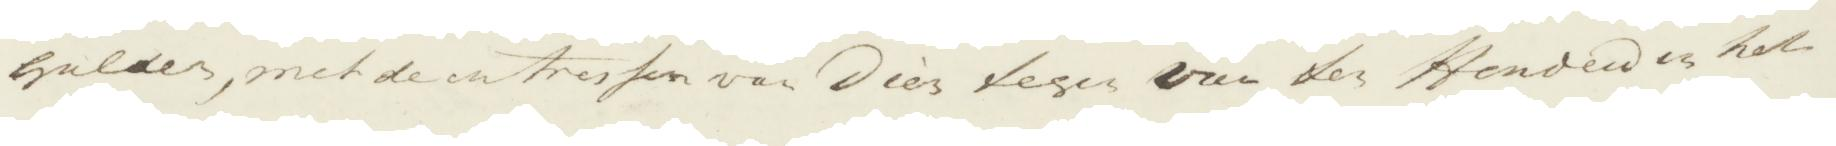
gulden, met de intressen van dien tegen vier ten Honderd in het
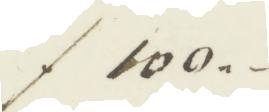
ƒ 100„-
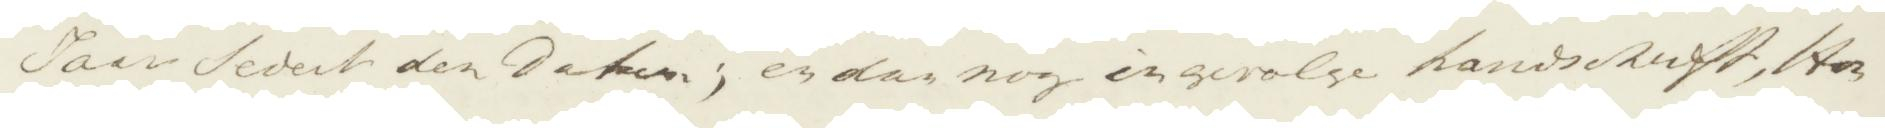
Iaar Sedert den datum; en dan nog ingevolge handschrift, Hon
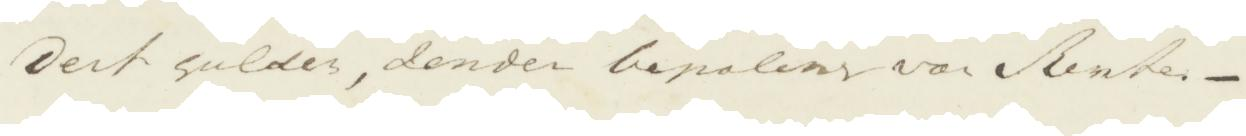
dert gulden, zonder bepaling van Rente.-
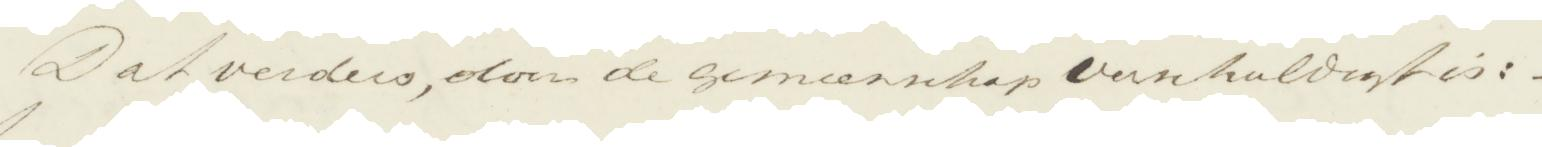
Dat verders, door de gemeenschap verschuldigt is:
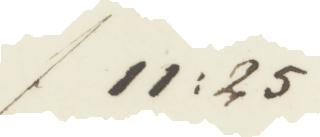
ƒ 11:25
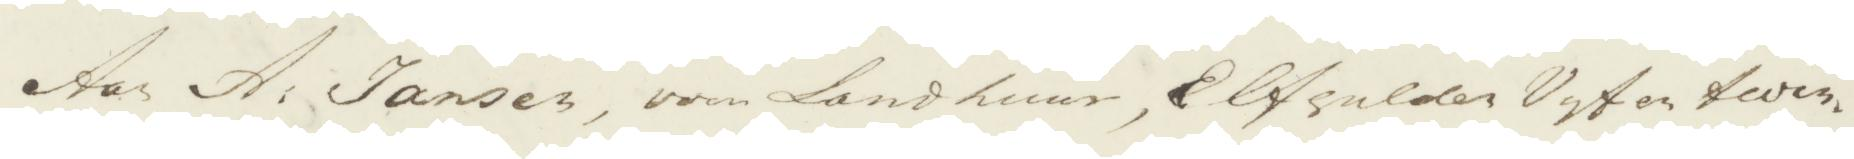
Aan A: Iansen, voor Landhuur, Elf gulden Vyf en twin
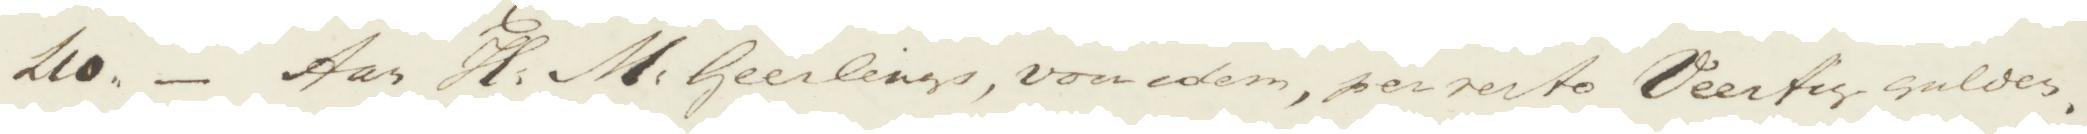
40„ — Aan H: M. Geerlings, voor idem, per recto Veertig gulden.
